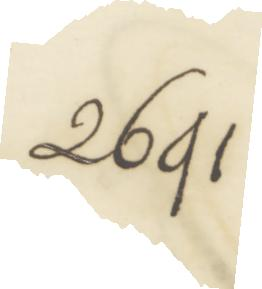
2641
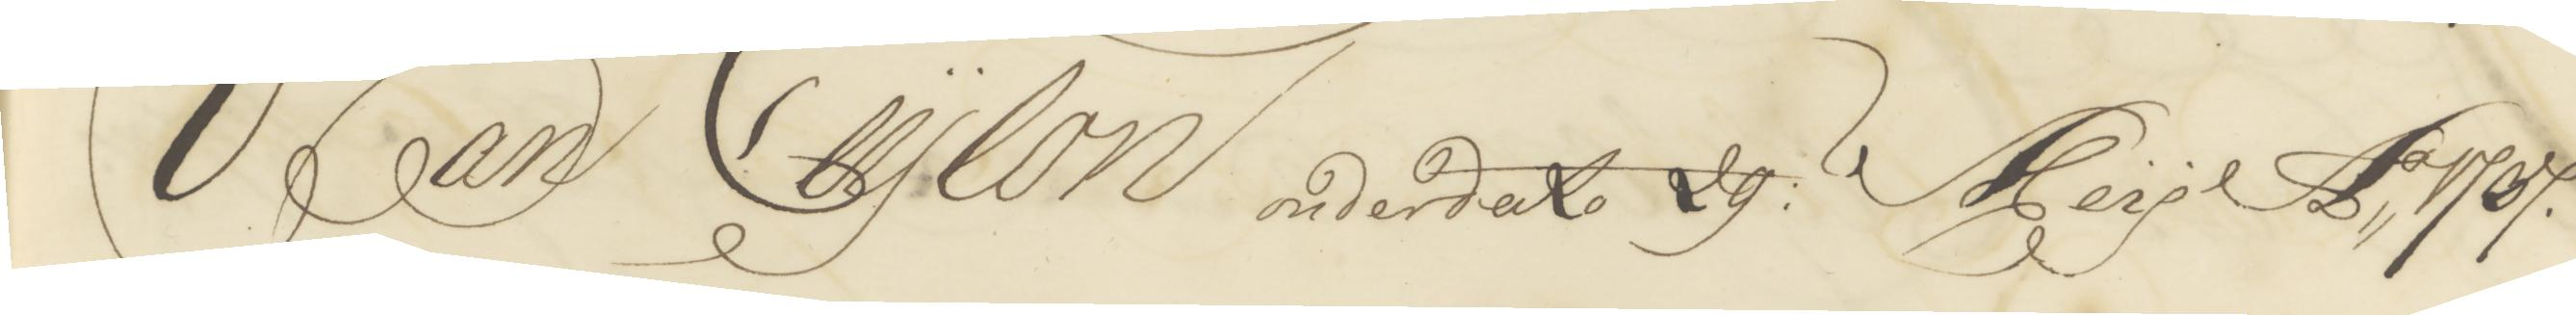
Van Ceijlon onderdato 29:' Meij A„o 1737.
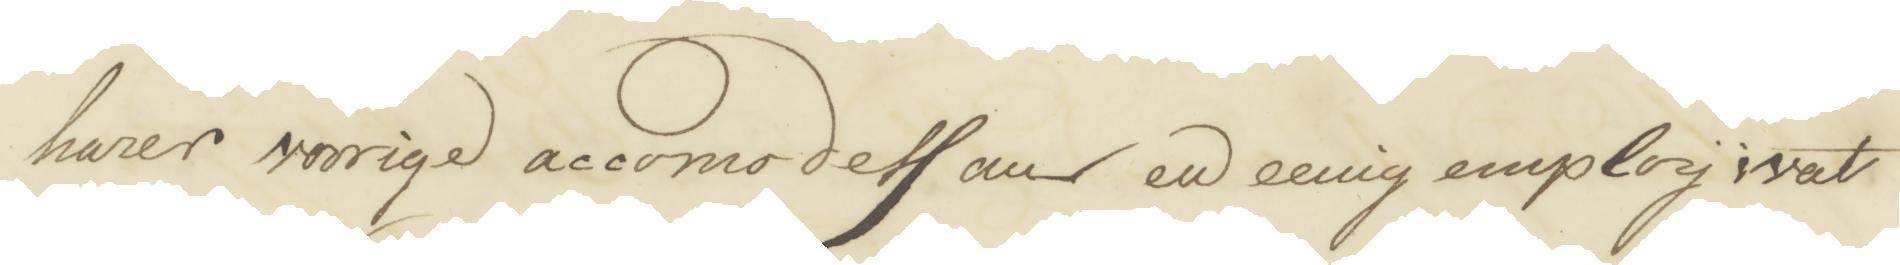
harer voorige accomodessan en eenig emploij wat
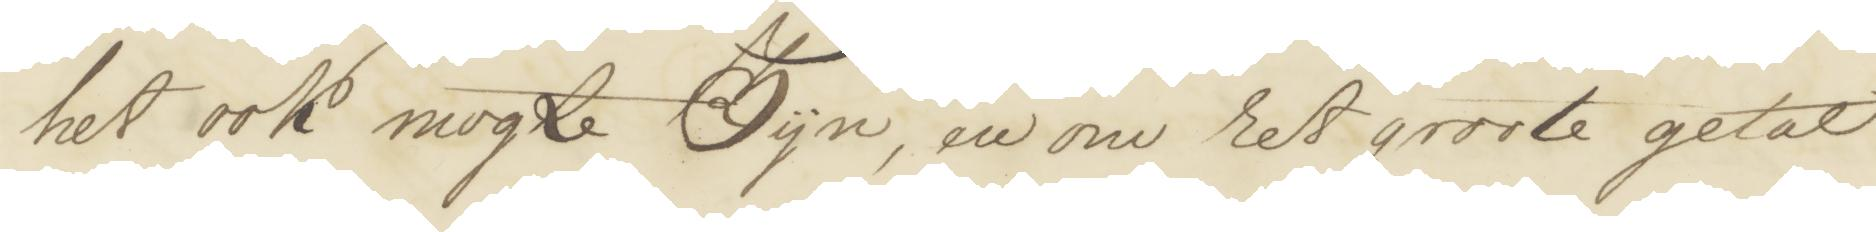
het ook mogte zijn, en om het groote getal
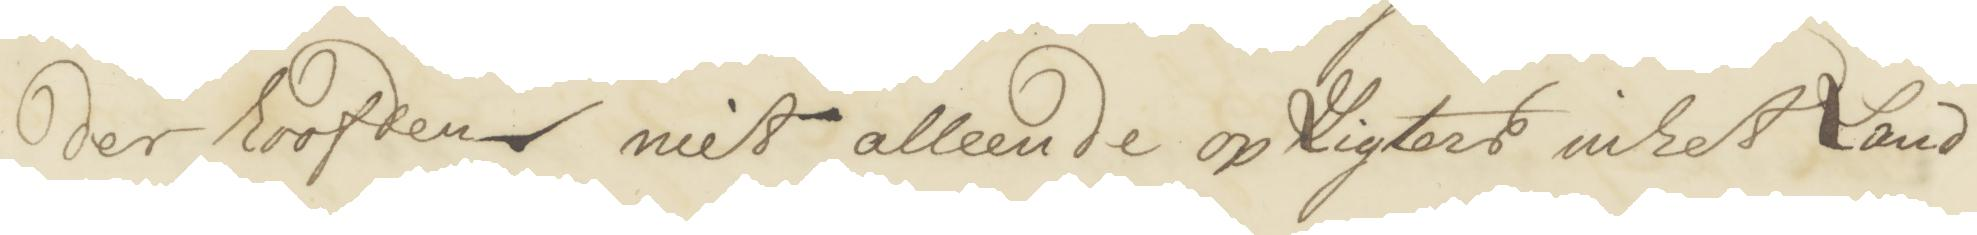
der hoofden niet alleen de opzigters inhet Land
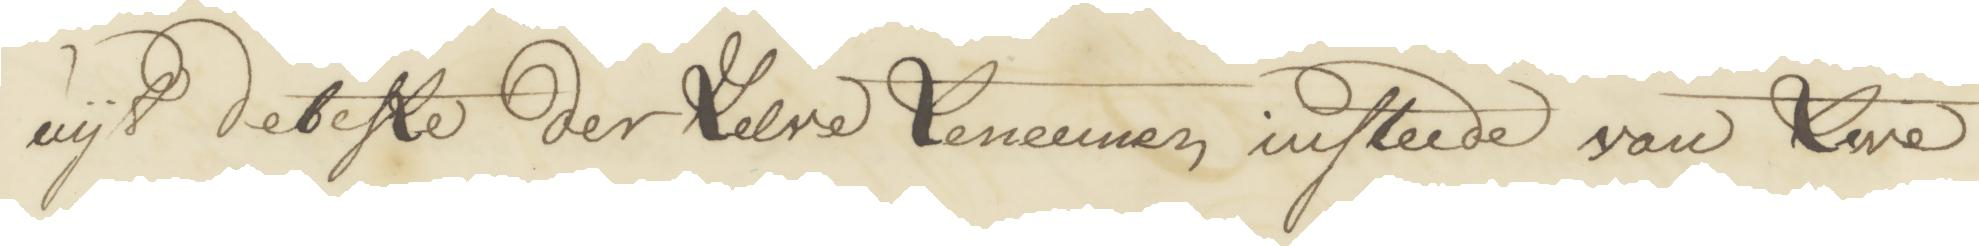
uijt debeste der zelve teneemen insteede van twe
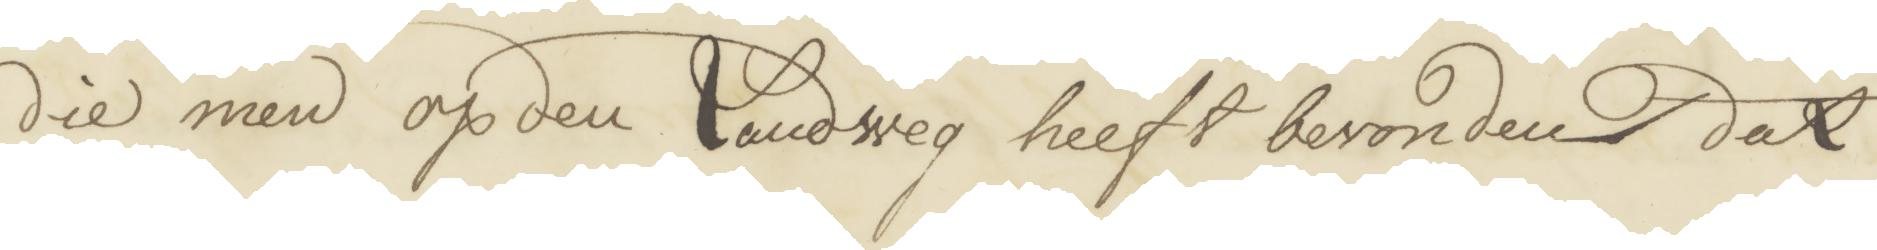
die men op den Landweg heeft bevonden dat
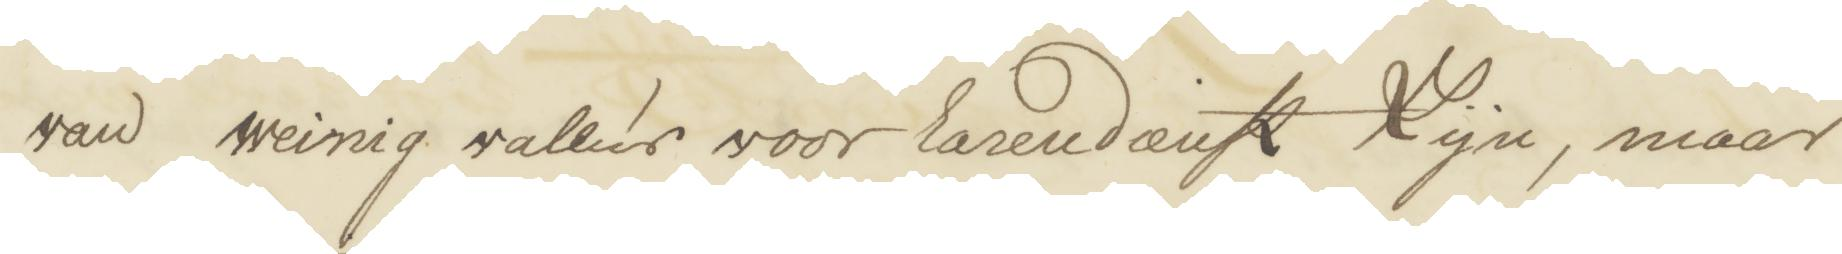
van weinig valeur voor harendienst zijn, maar
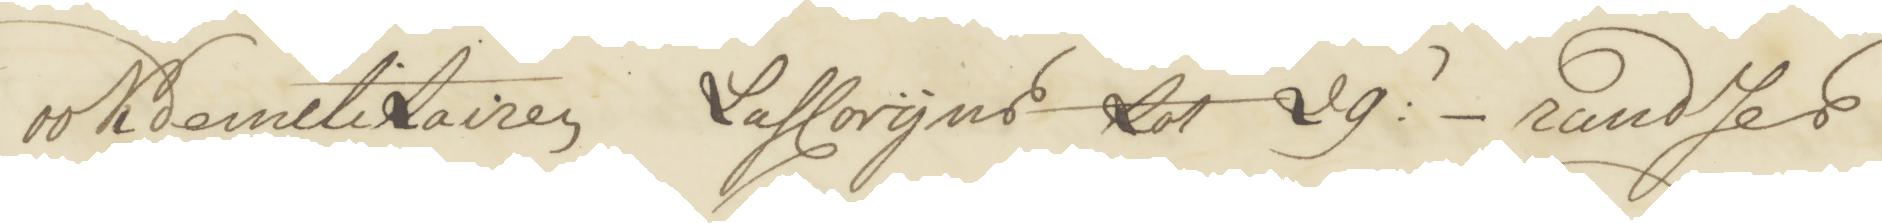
ookdemilitairen Lascorijns tot 29:' – randjes
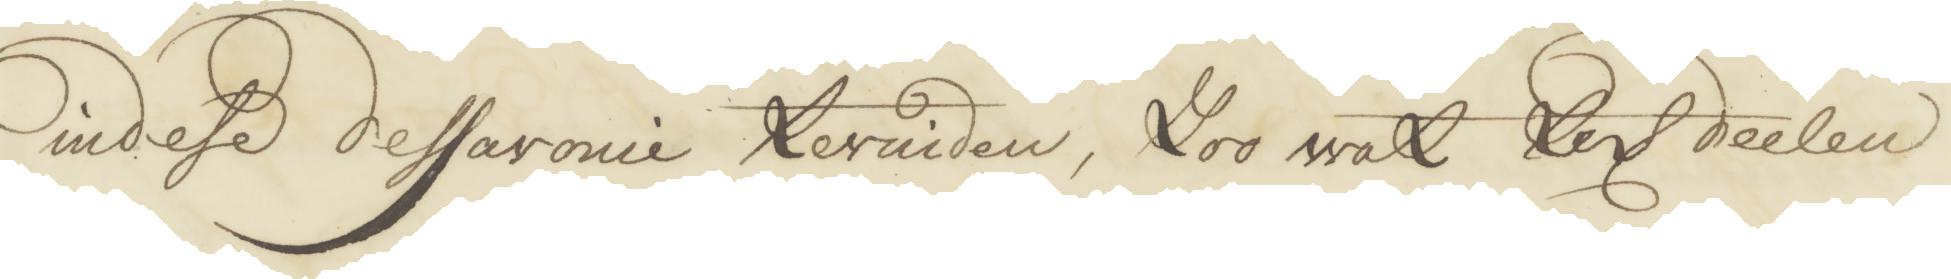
indese dessavonie tevinden, zoo wat teverdeelen
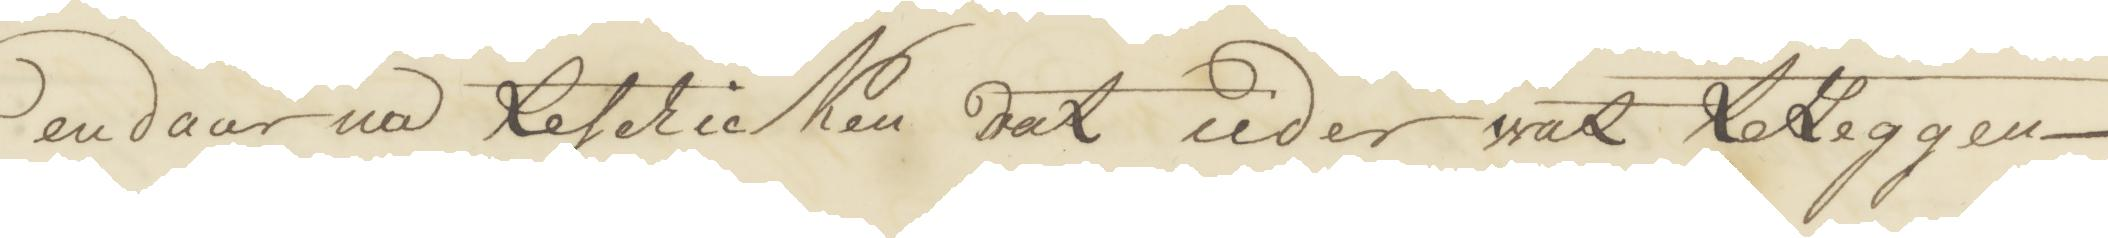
en daar na teschicken dat ieder wat tezeggen —
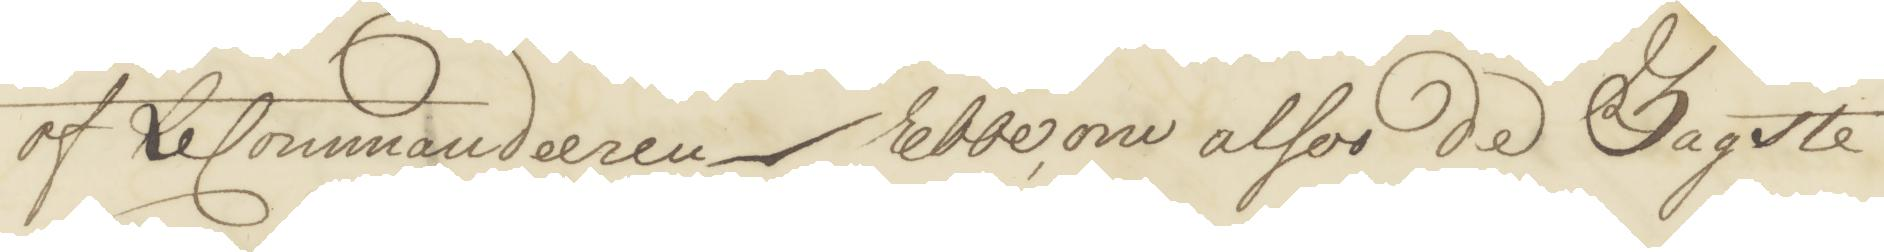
of tecommandeeren hebbe, om alsoo de Zagste
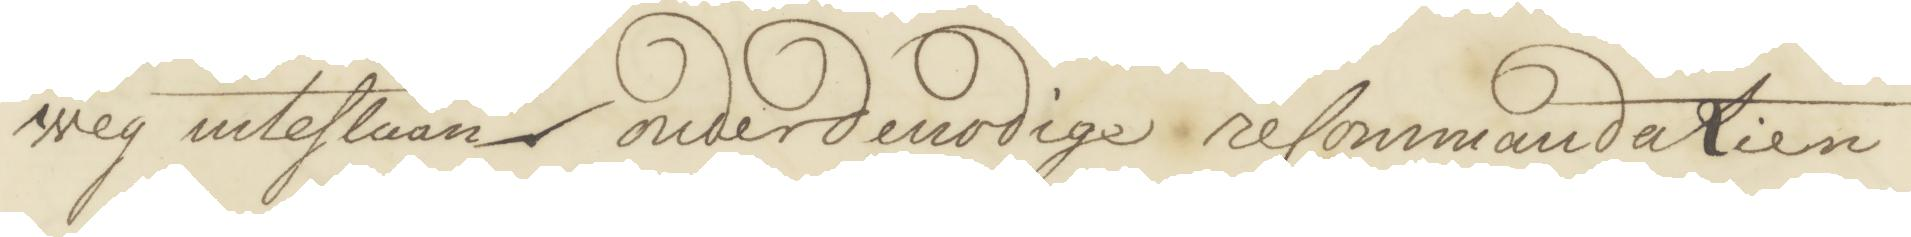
weg inteslaan onderdenodige recommandatien
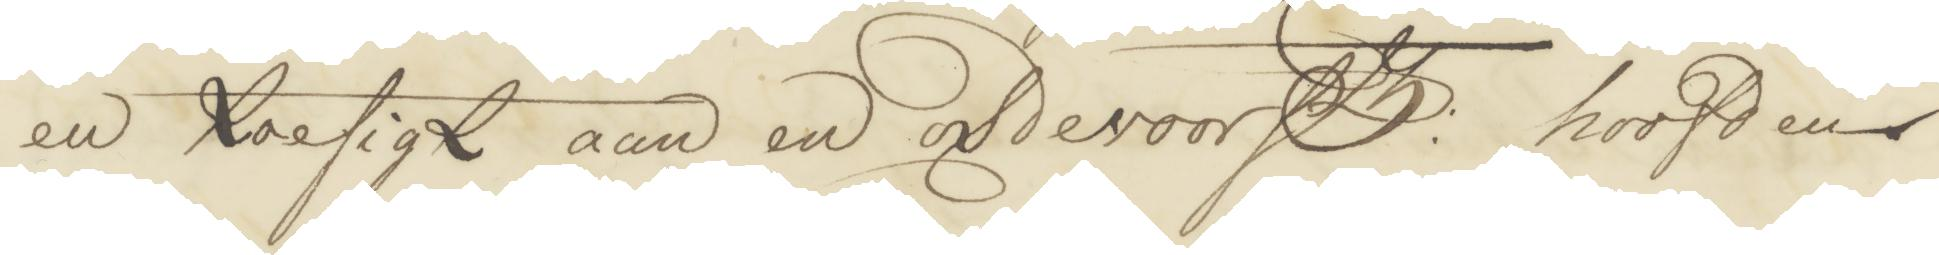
en toesigt aan en overdevoorsz: hoofden
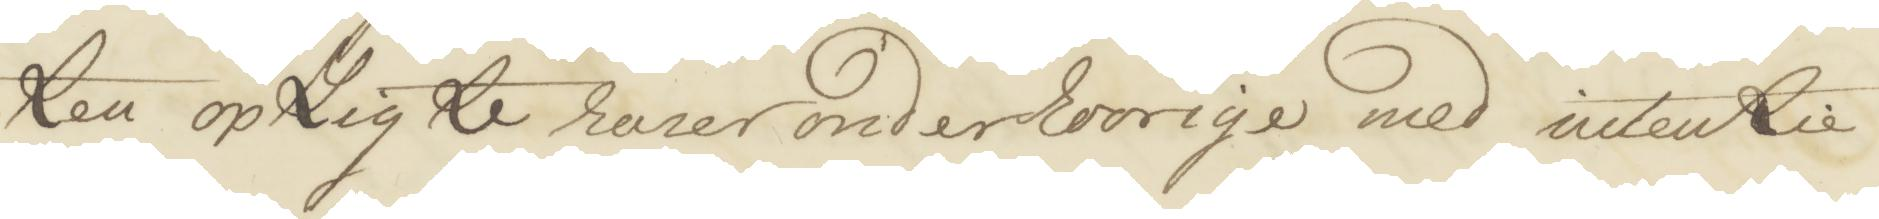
ten opzigte harer onderhoorige med intentie
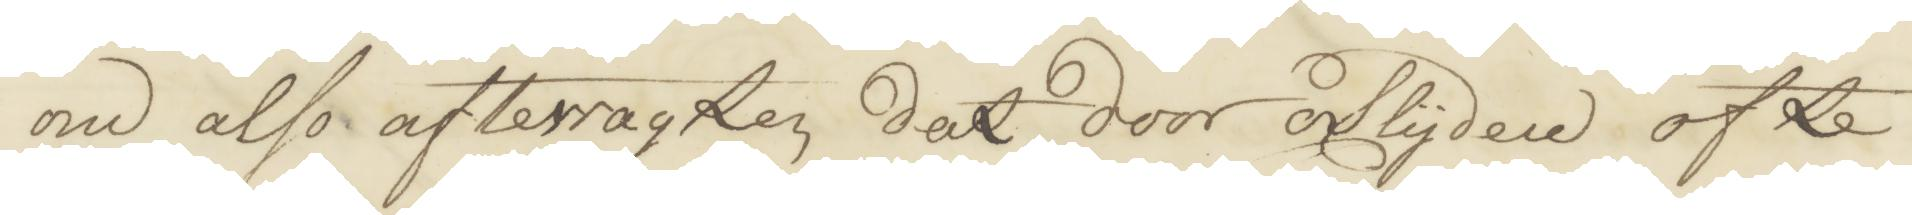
om also aftewagten dat door overlijden ofte
